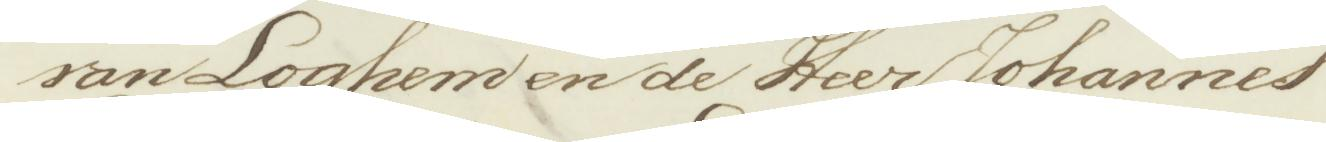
van Loghem en de Heer Johannes
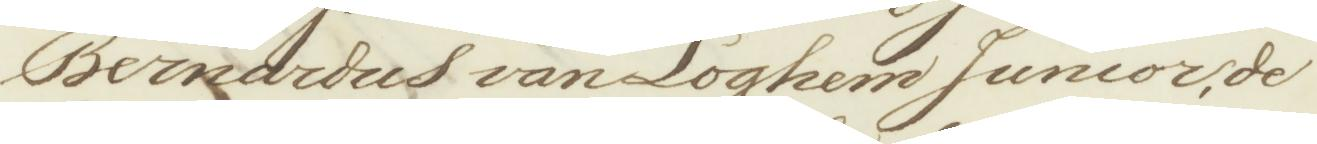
Bernardus van Loghem Junior, de
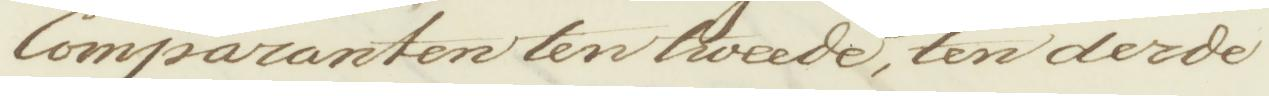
Comparanten ten tweede, ten derde
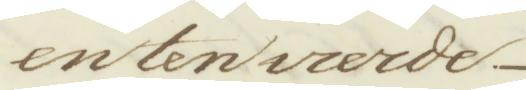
en ten vierde. —
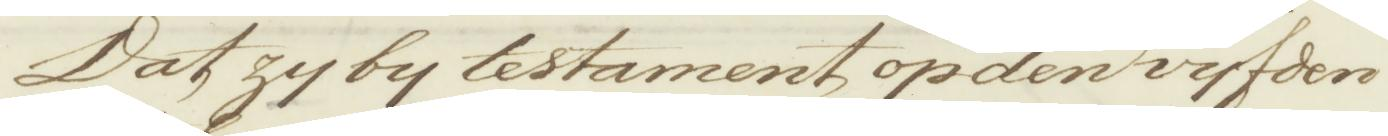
Dat zy by testament op den vyfden
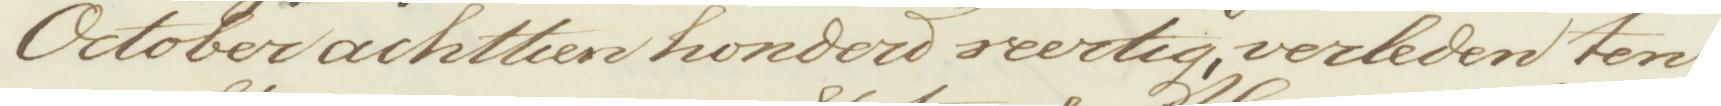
October achttien honderd veertig, verleden ten
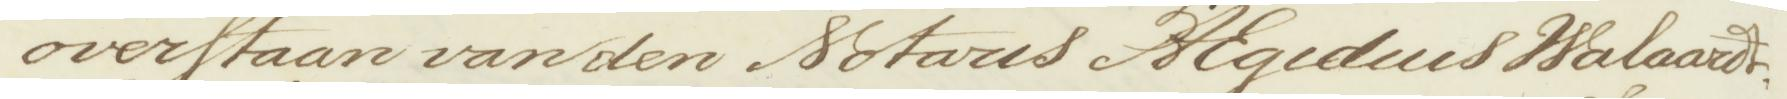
overstaan van den Notaris AEgidius Walaardt
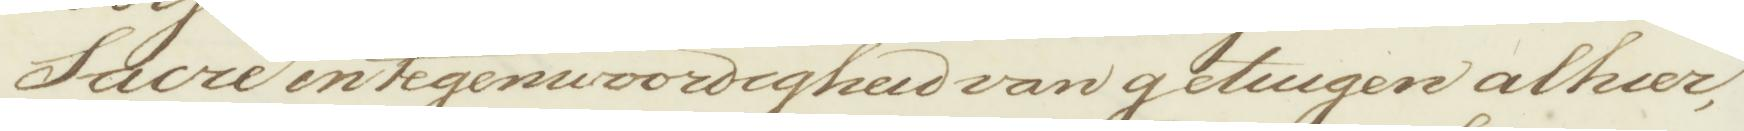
Sacré in tegenwoordigheid van getuigen alhier,
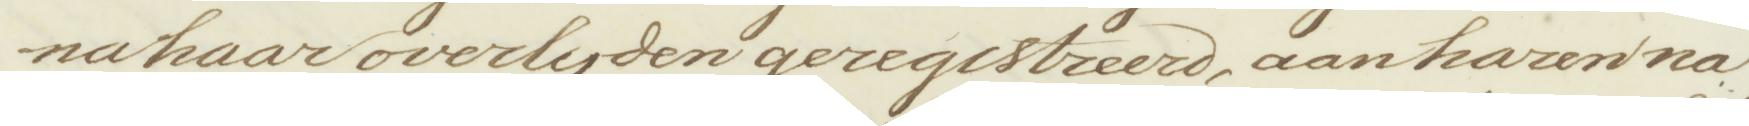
na haar overlyden geregistreerd, aan haren na
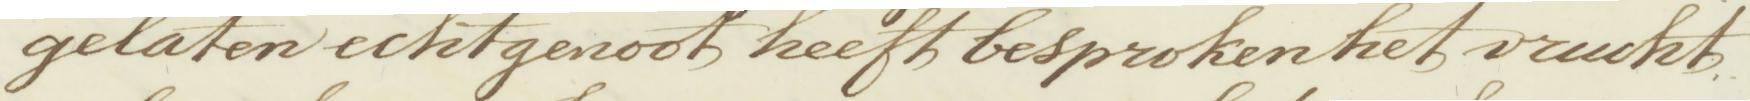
gelaten echtgenoot heeft besproken het vrucht„
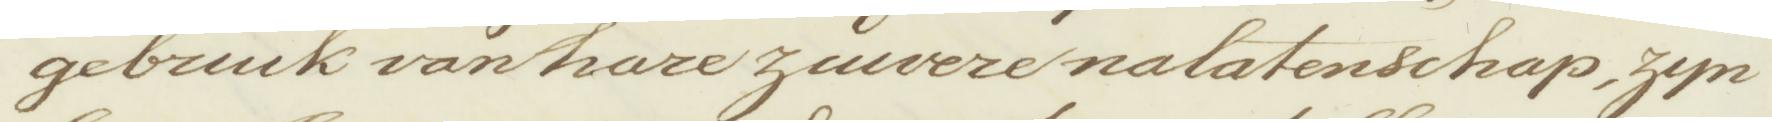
gebruik van hare zuivere nalatenschap, zyn
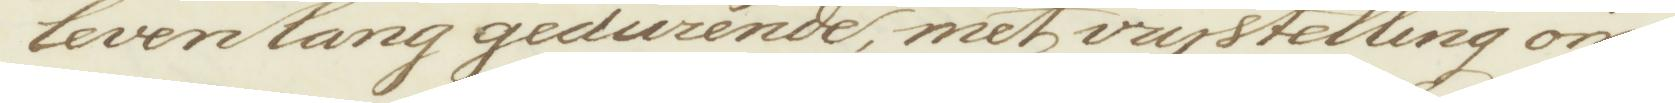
leven lang gedurende, met vrystelling om
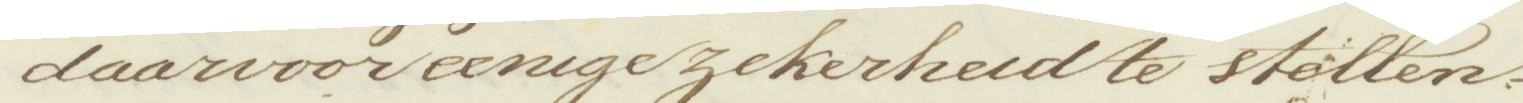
daarvoor eenige zekerheid te stellen.
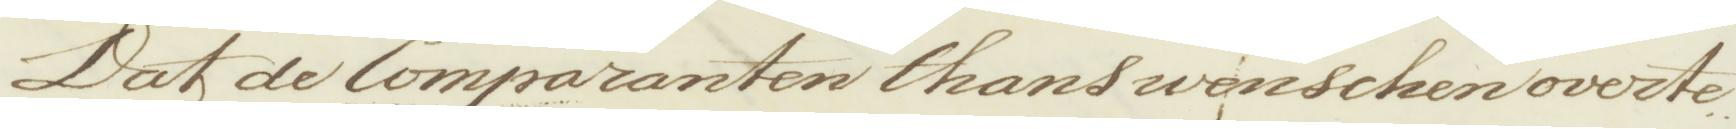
Dat de Comparanten thans wenschen overte„
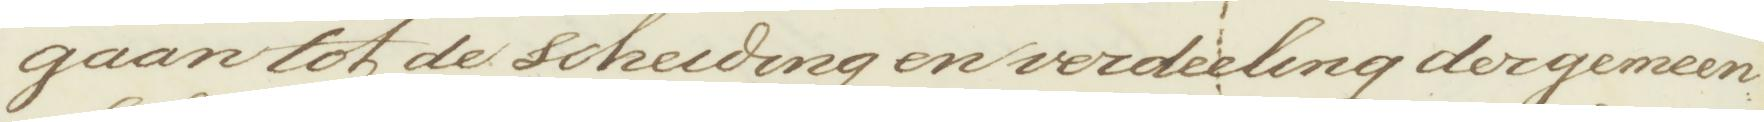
gaan tot de scheiding en verdeeling der gemeen„
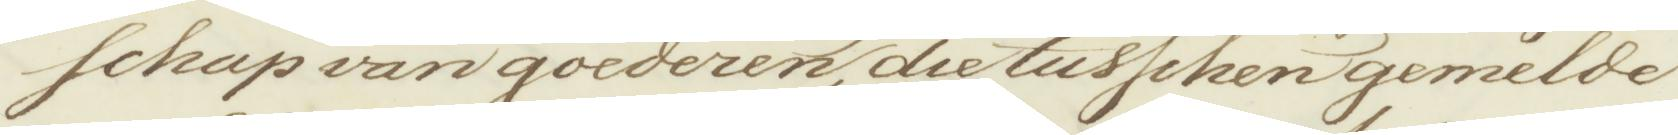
schap van goederen, die tusschen gemelde
